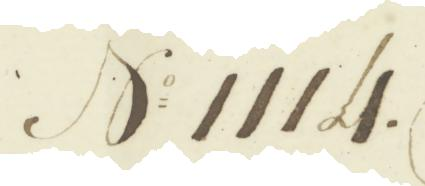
N:o 1114.
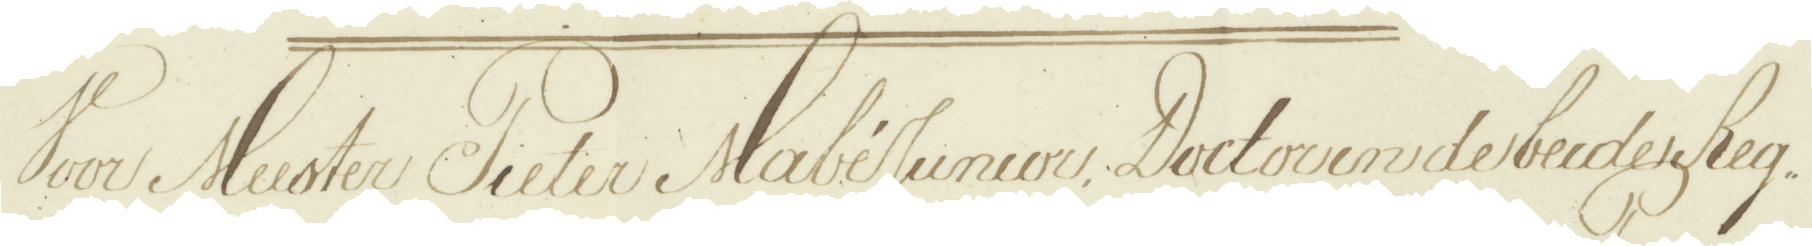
Voor Meester Pieter Mabé Junior, Doctor in de beiden Reg„
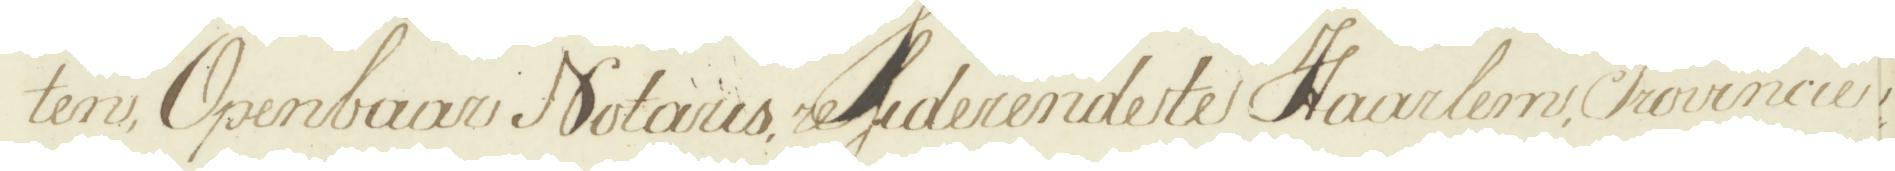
ten, Openbaar Notaris, residerende te Haarlem, Provincie
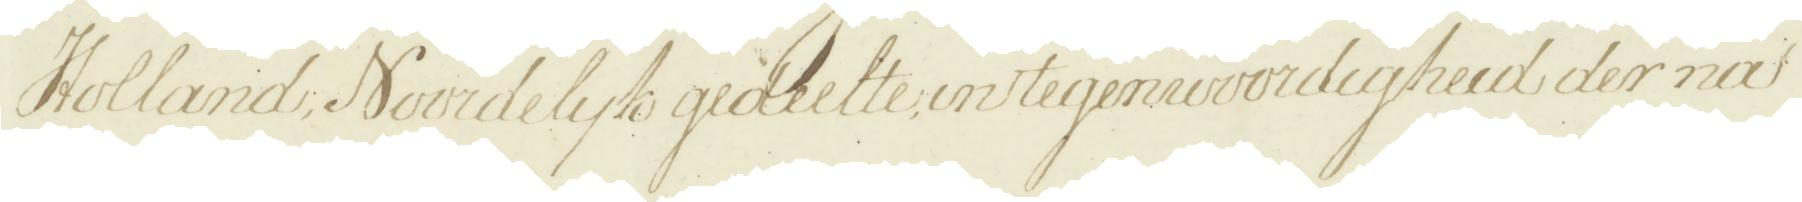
Holland, Noordelyk gedeelte in tegenwoordigheid der na
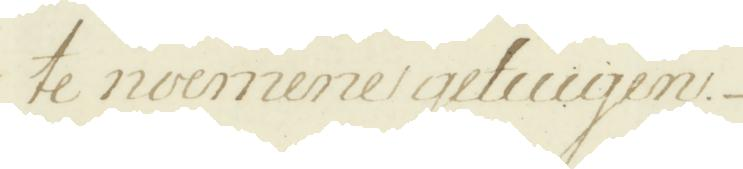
te noemene getuigen.-
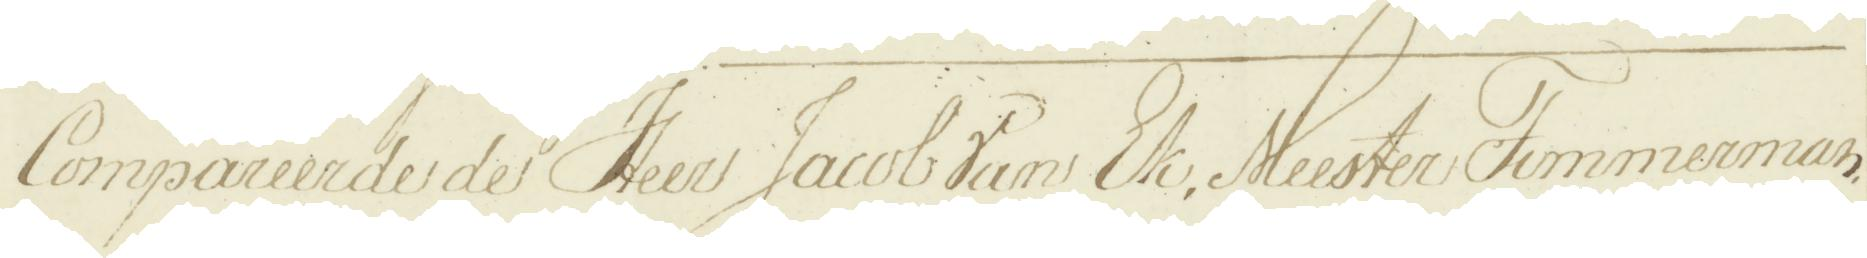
Compareerde de Heer Jacob van Ek, Meester Timmerman,
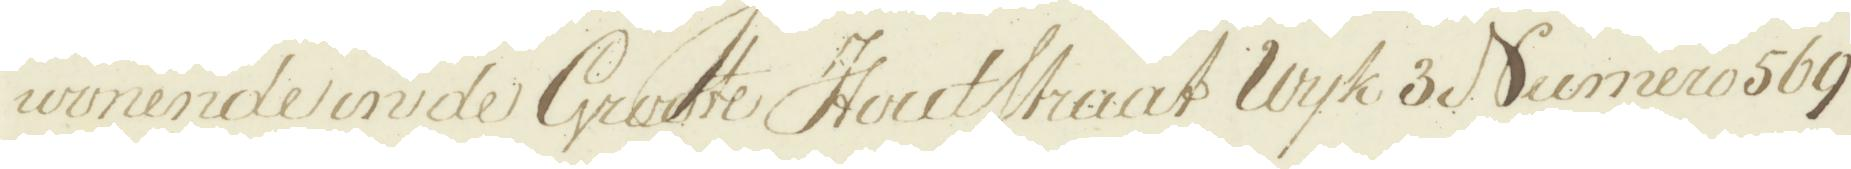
wonende in de Groote Houtstraat Wyk 3 Numero 569
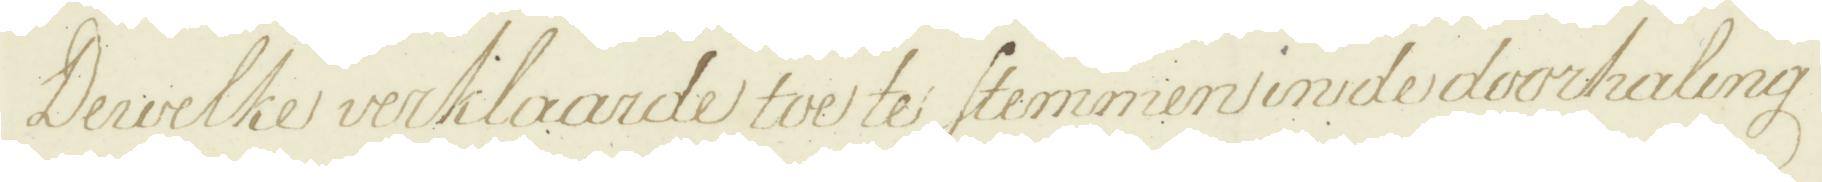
Dewelke verklaarde toe te stemmen in de doorhaling
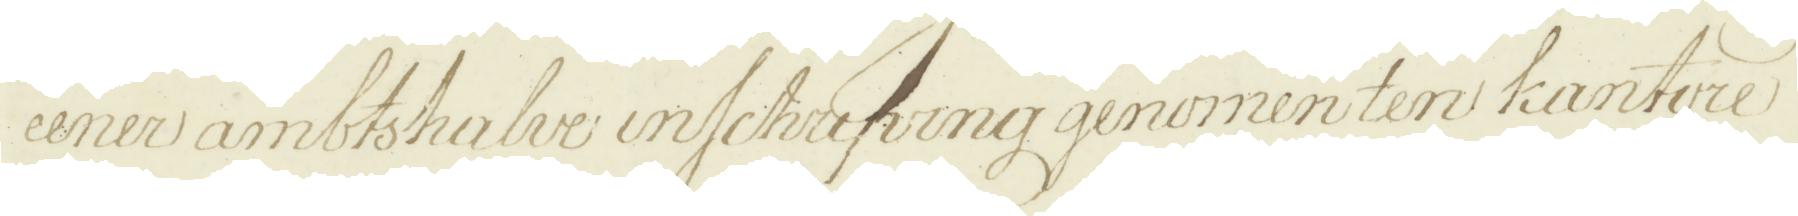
eener ambtshalve inschryving genomen ten kantore
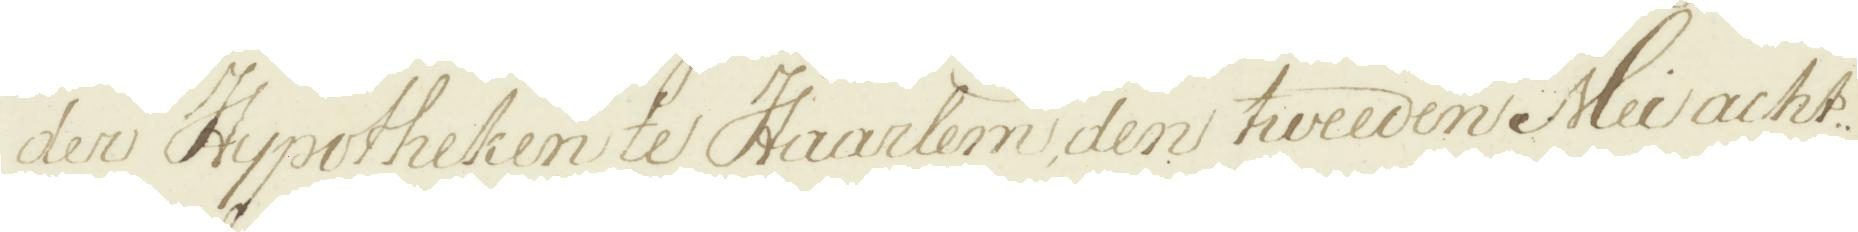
der Hypotheken te Haarlem, den tweeden Mei acht„
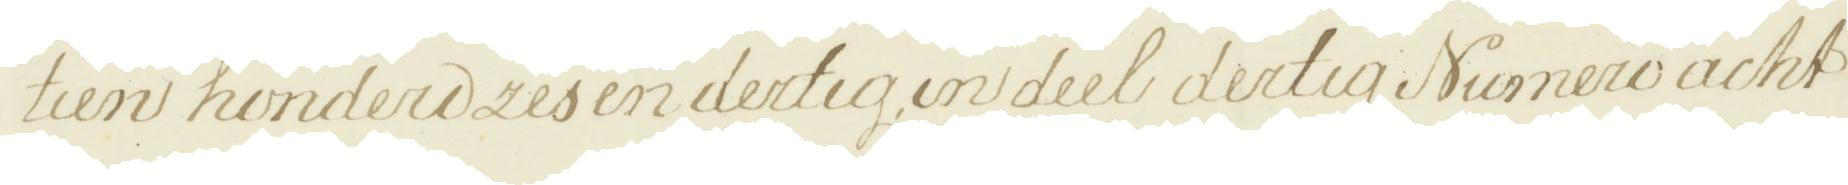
tien honderd zes en dertig, in deel dertig Numero acht
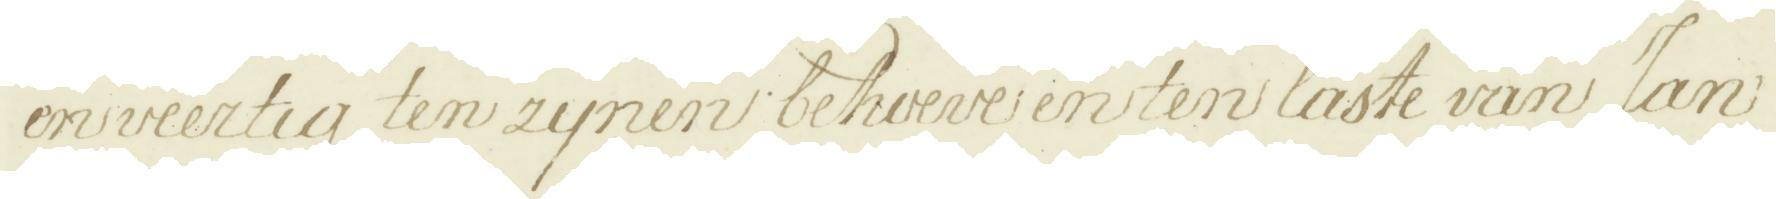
en veertig ten zynen behoeve en ten laste van Jan
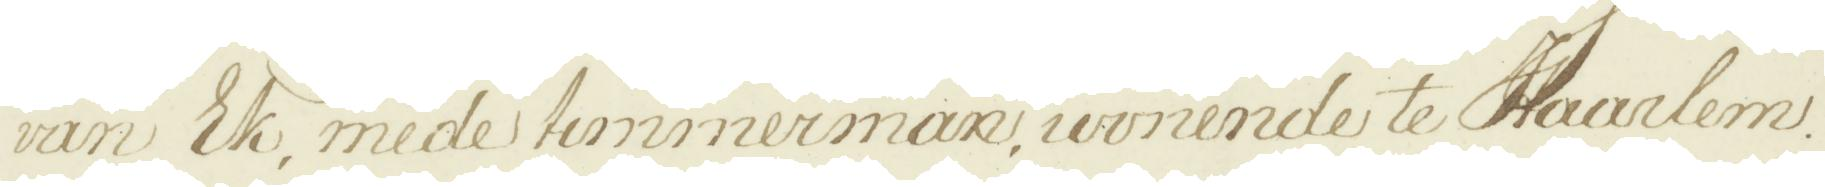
van Ek, mede timmerman, wonende te Haarlem.
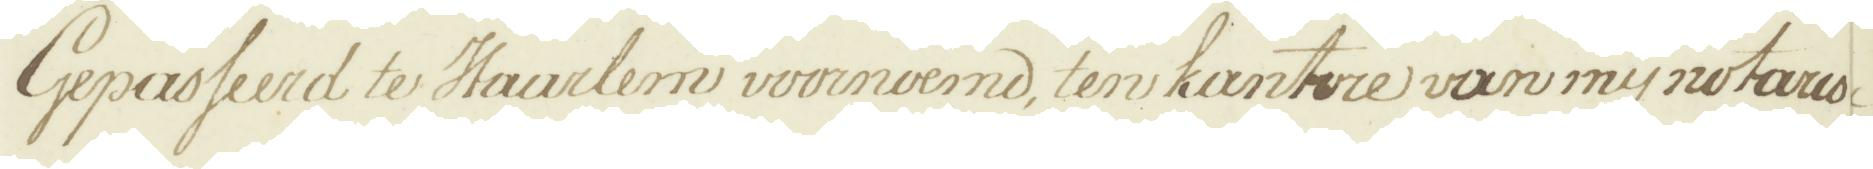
Gepasseerd te Haarlem voornoemd, ten kantore van my notaris
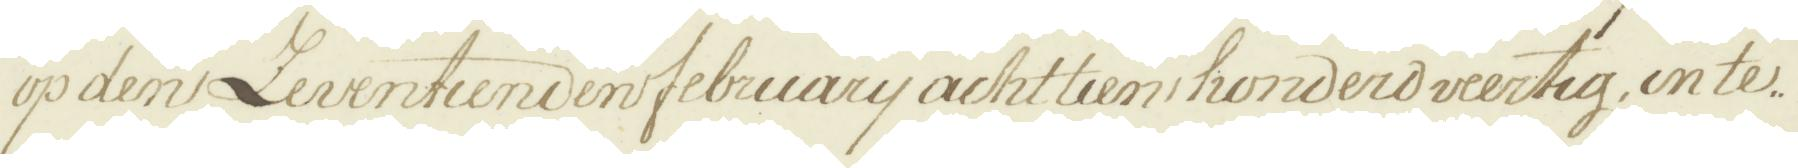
op den Zeventienden february achttien honderd veertig, in te„
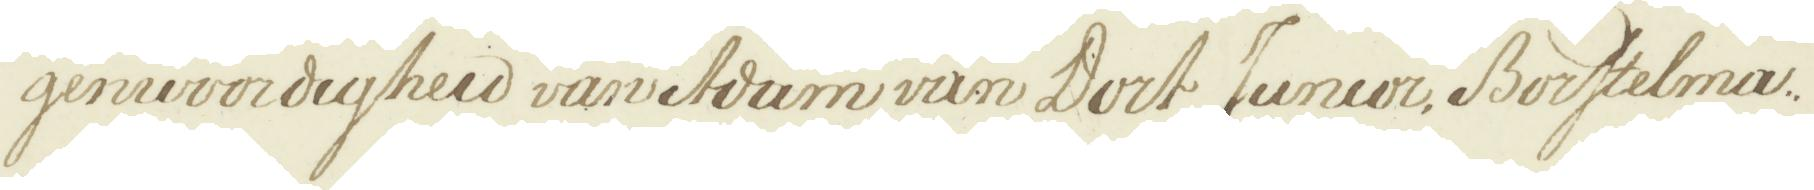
genwoordigheid van Adam van Dort Junior, Borstelma„
